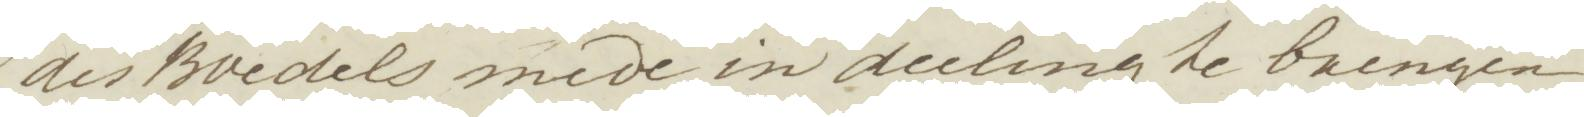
des Boedels mede in deeling te brengen,
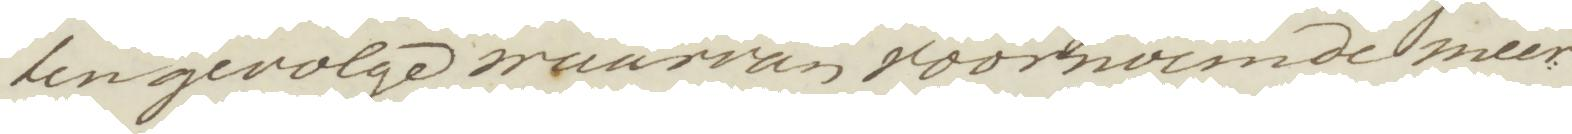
ten gevolge waarvan voornoemde meer:
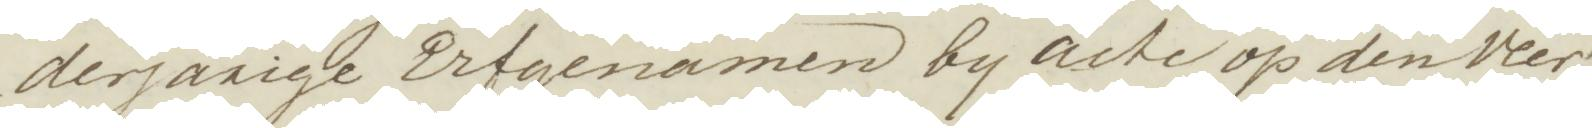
=derjarige Erfgenamen by acte op den Veer:
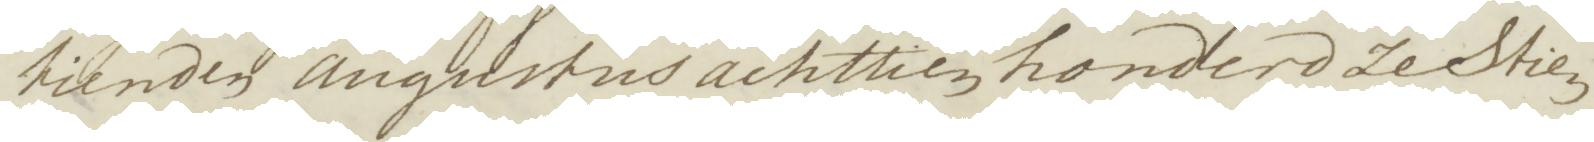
=tienden Augustus achttien honderd zestien
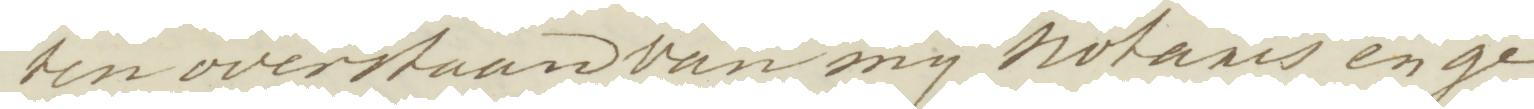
ten overstaan van my notaris en ge=
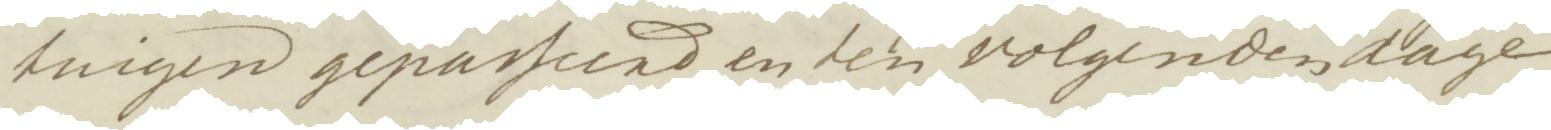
=tuigen gepasseerd, en ten volgenden dage
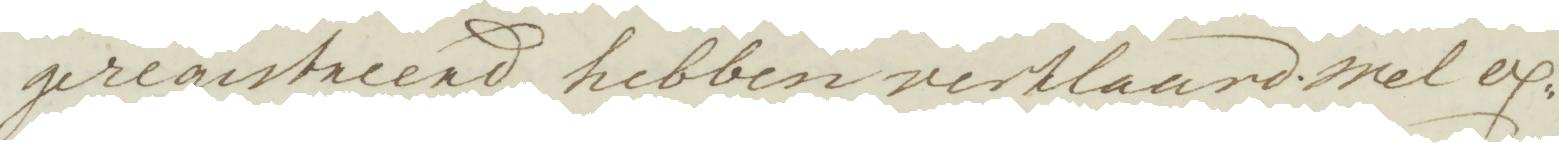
geregistreerd, hebben verklaard, wel ex„
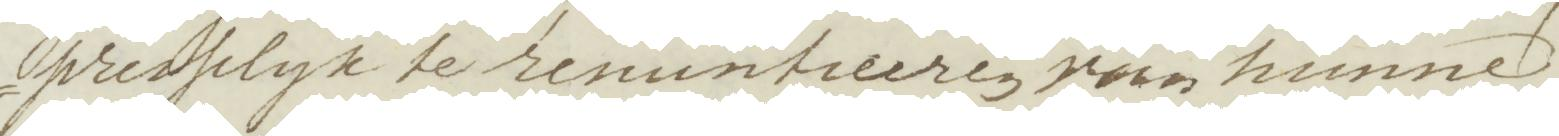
„presselyk te renuntieeren van hunne
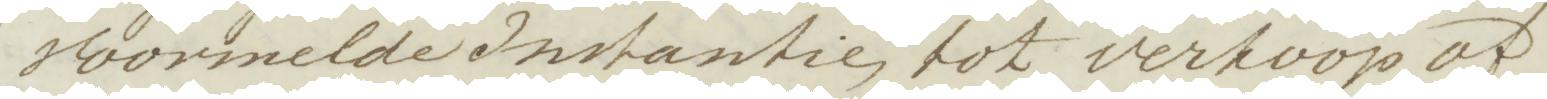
voormelde Instantie tot verkoop of
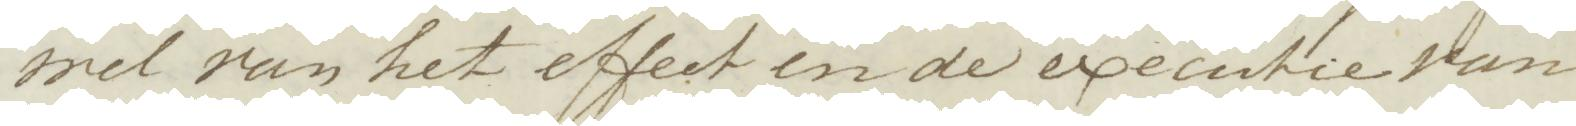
wel van het effect en de executie van
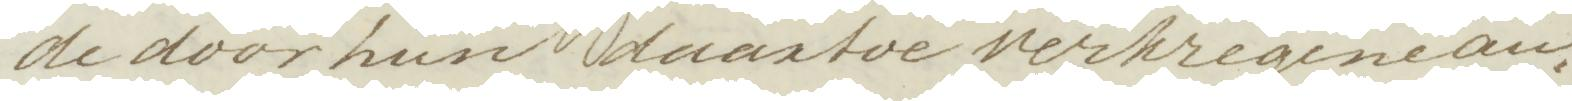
de door hun daartoe verkregene au=
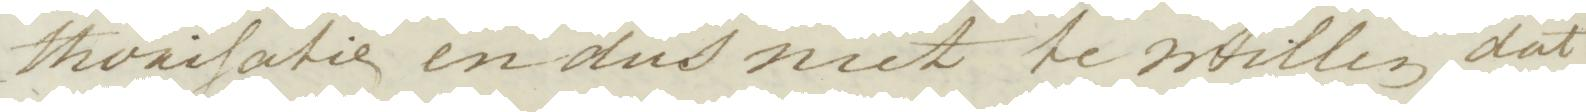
=thorisatie en dus niet te willen, dat
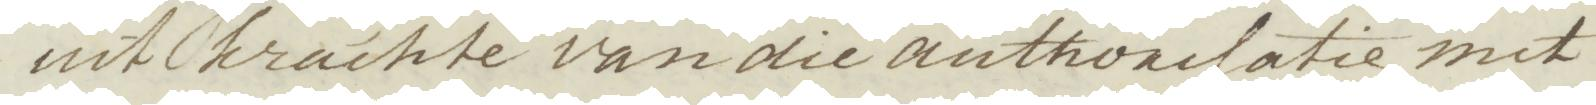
uit krachte van die authorisatie met
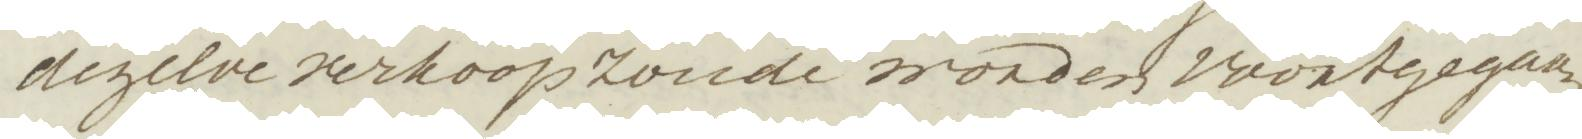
dezelve verkoop zoude worden voortgegaan
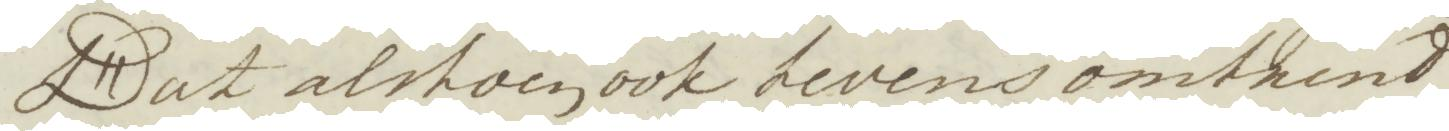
Dat alstoen ook tevens omtrend
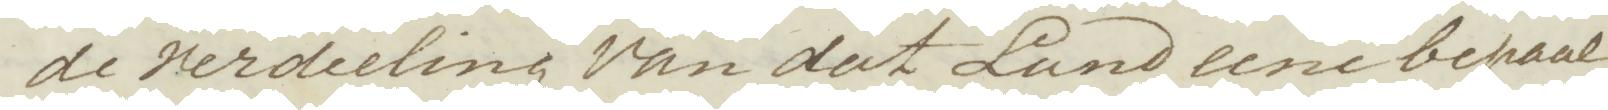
de verdeeling van dat Land eene bepaal:
